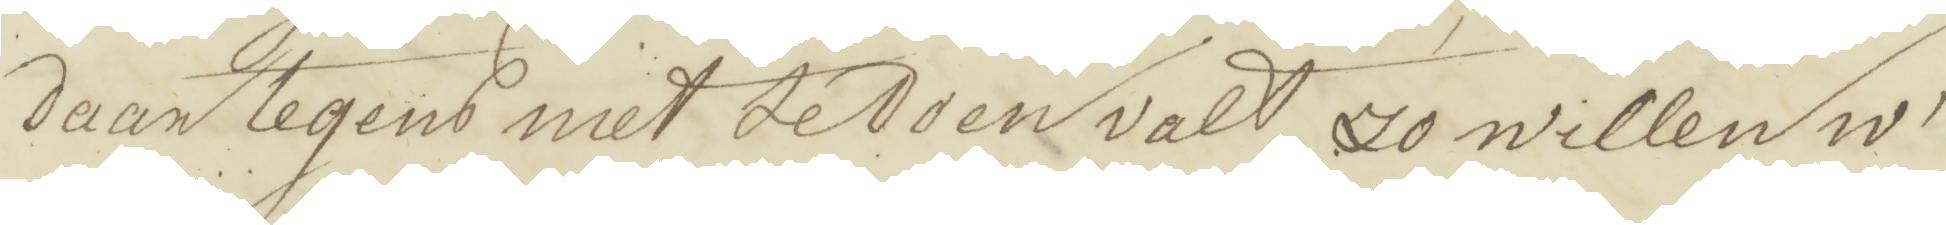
daar tegens niet te doen valt, zo willen w'
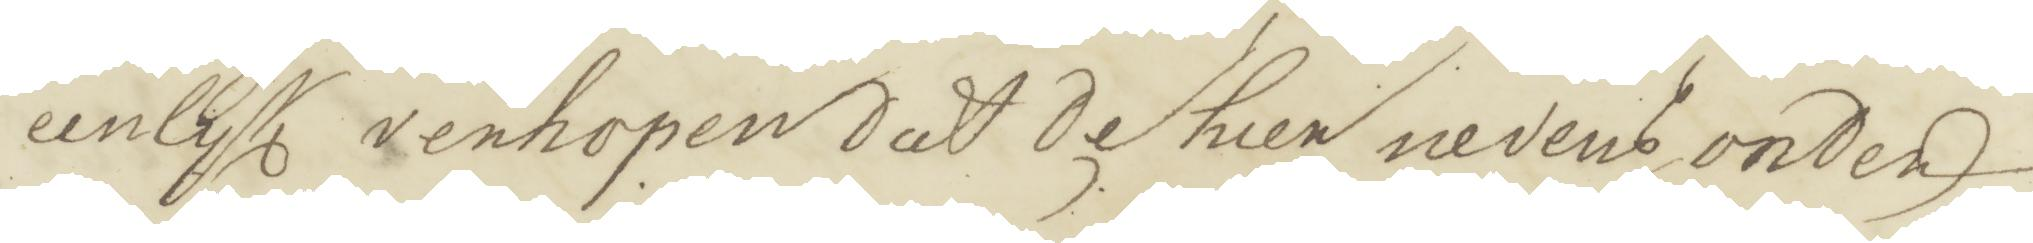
eenlijk verhopen dat de hier nevens onder
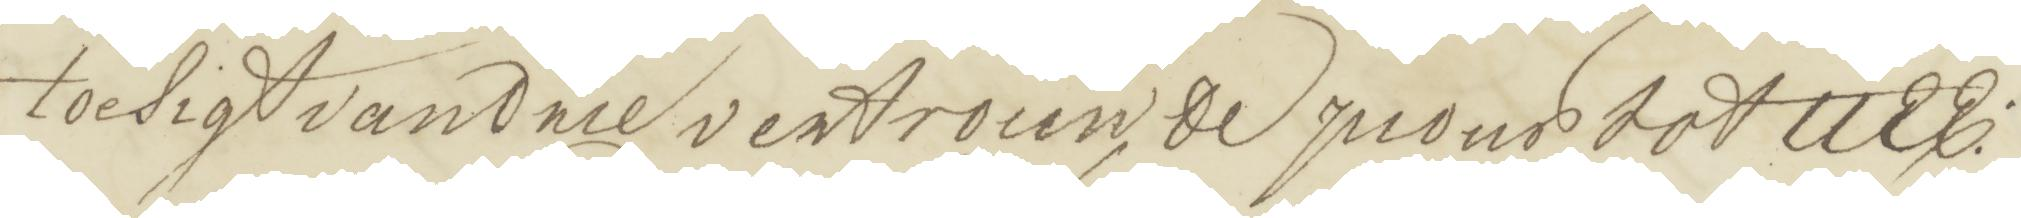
toesigt van drie vertrouwde pions tot UEE:
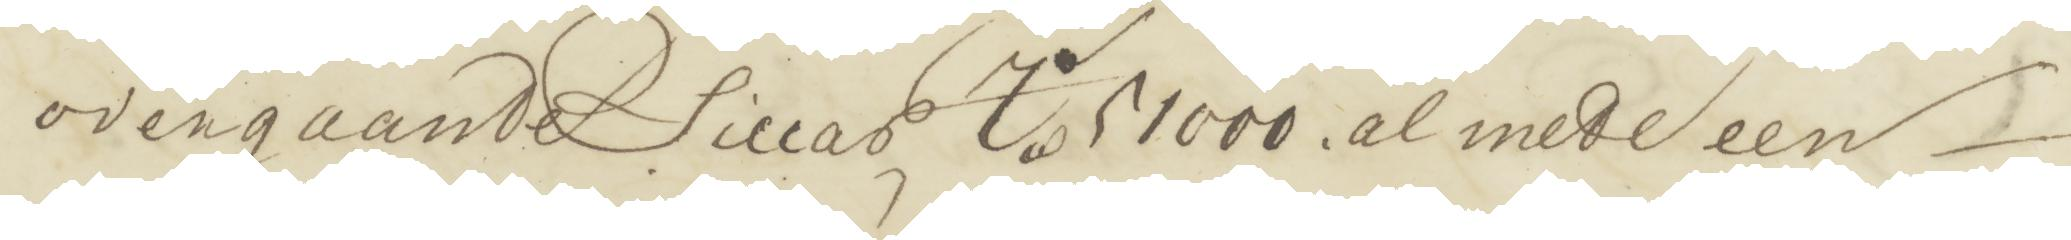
overgaande Siccas R o/a 51000 al mede een
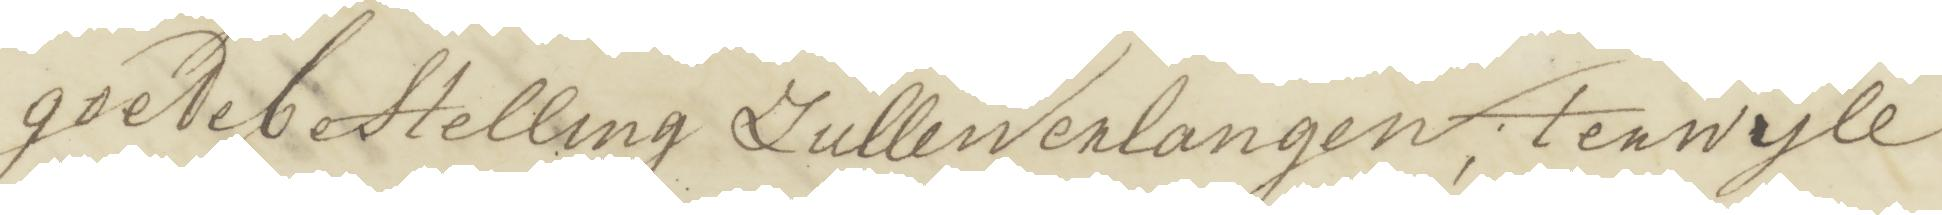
goede bestelling Zullen erlangen, terwijle
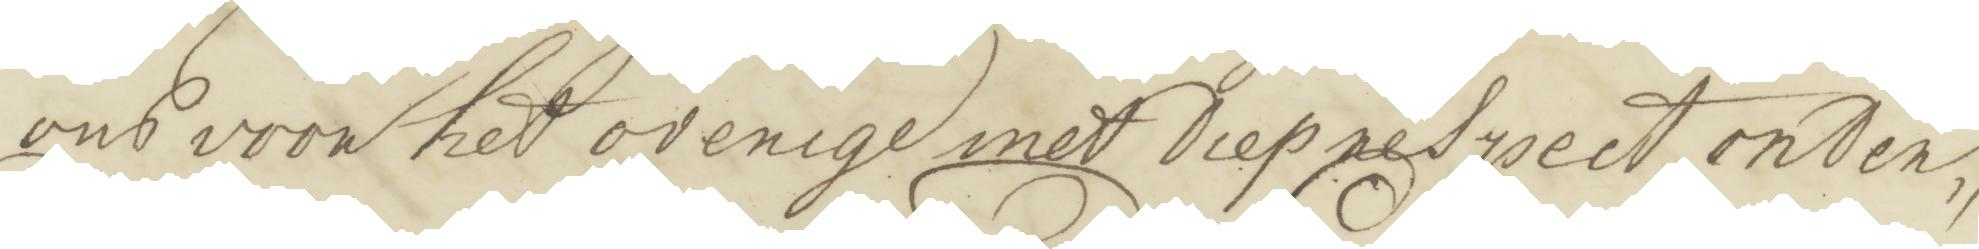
ons voor het overige met diep respect onder„
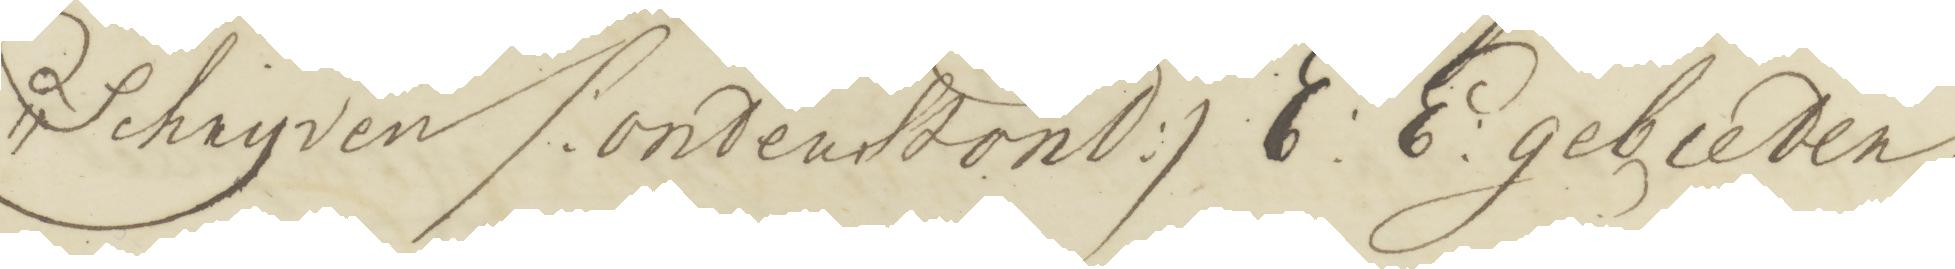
„Schrijven /:onderstond:/ E: E: gebieden
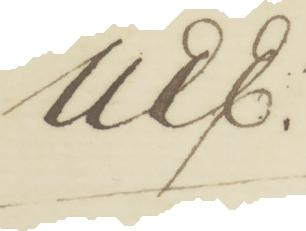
UEE.
